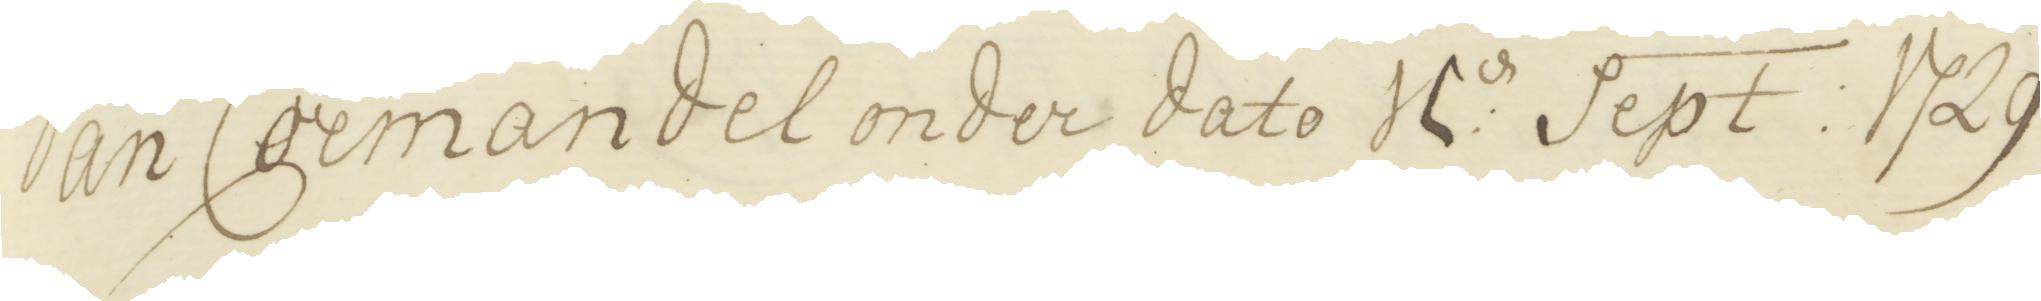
Van Cormandel onder dato 15:en Sept: 1729
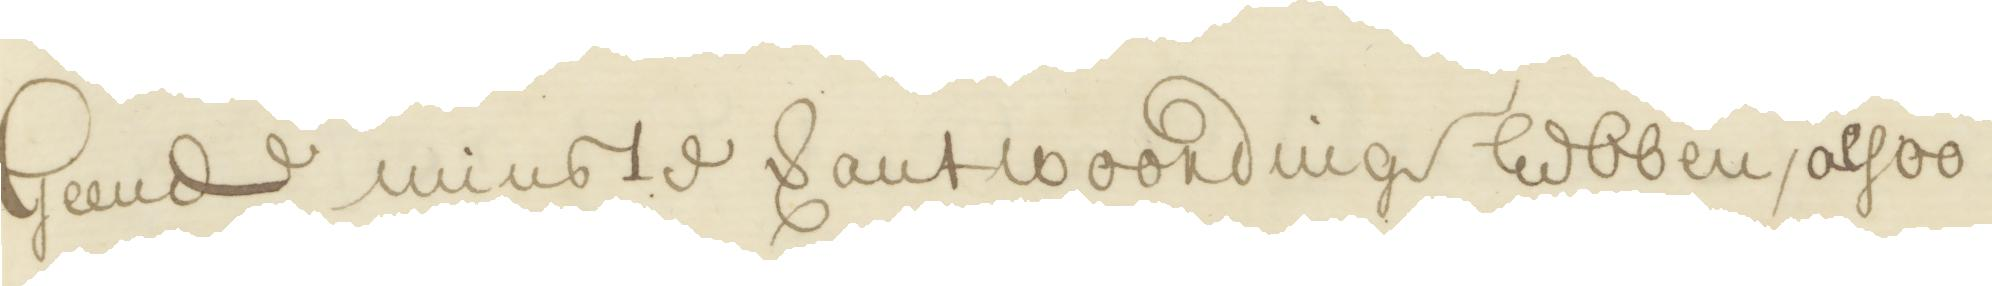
Geende minste verantwoordinge hebben, alsoo
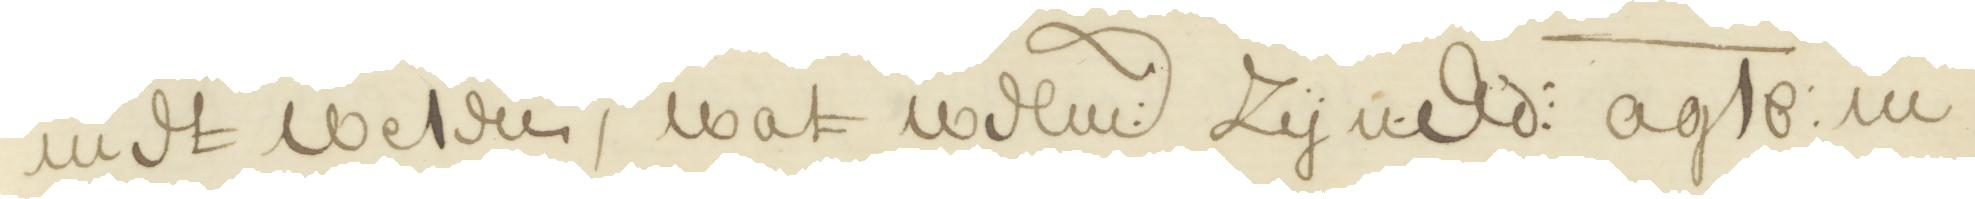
niet weten, wat welm: zij uEd: agtb: in
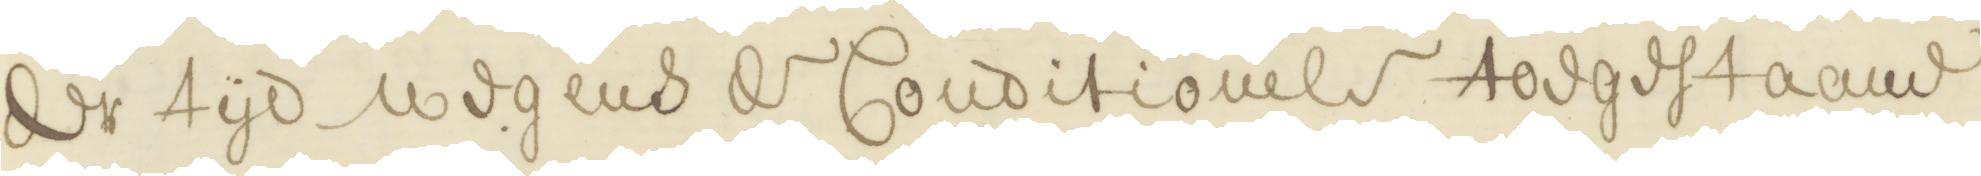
der tijd wegens de Conditionele toegestaane
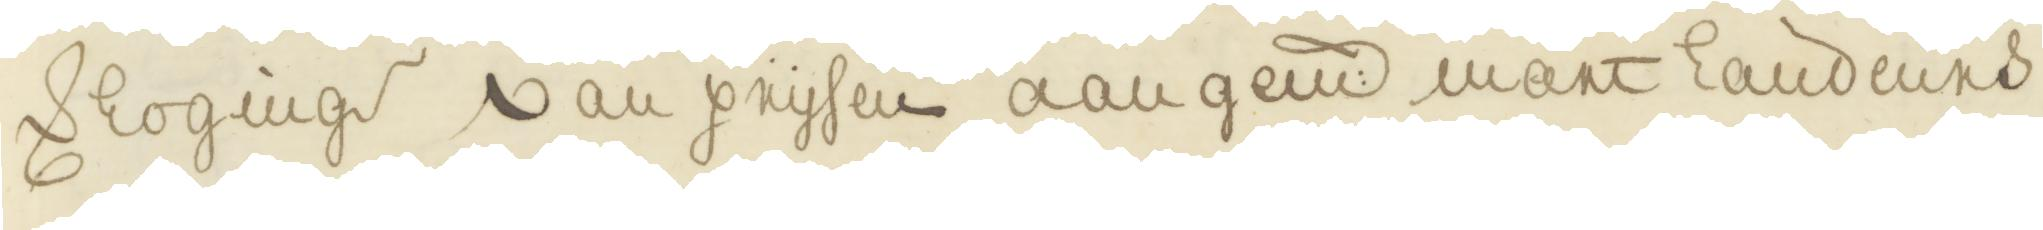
verhoginge van prijsen aan gem: marchandeurs
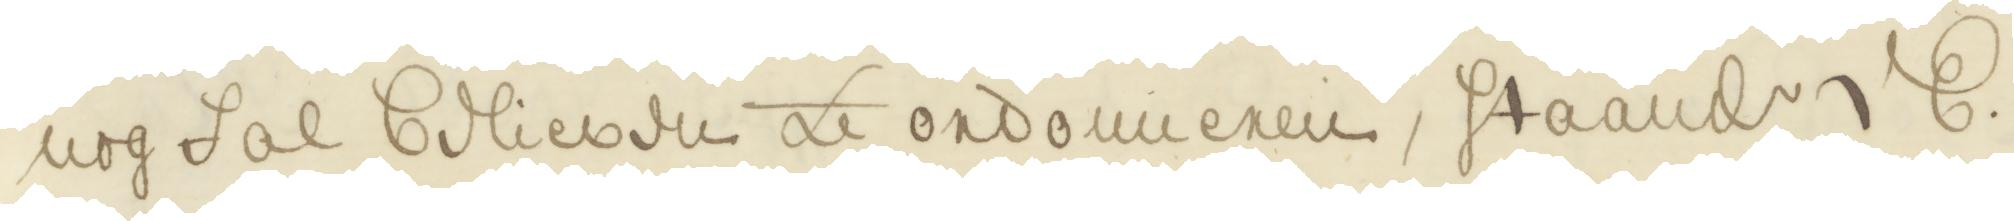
nog sal believen te ordonneren, staande VE.
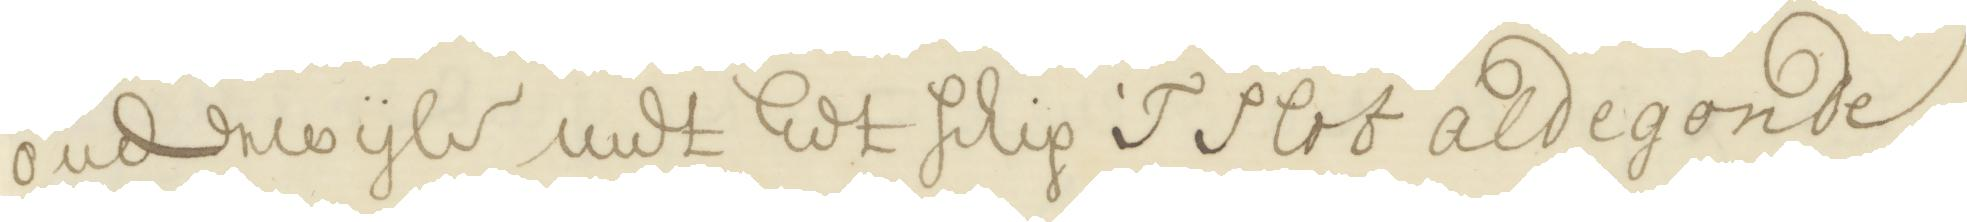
onderwijle met het schip 'T slot aldegonde,
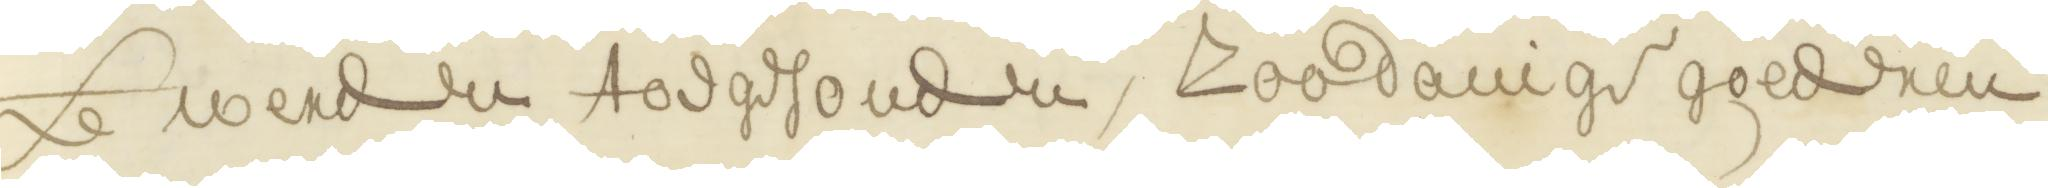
te werden toegesonden, zoodanige goederen
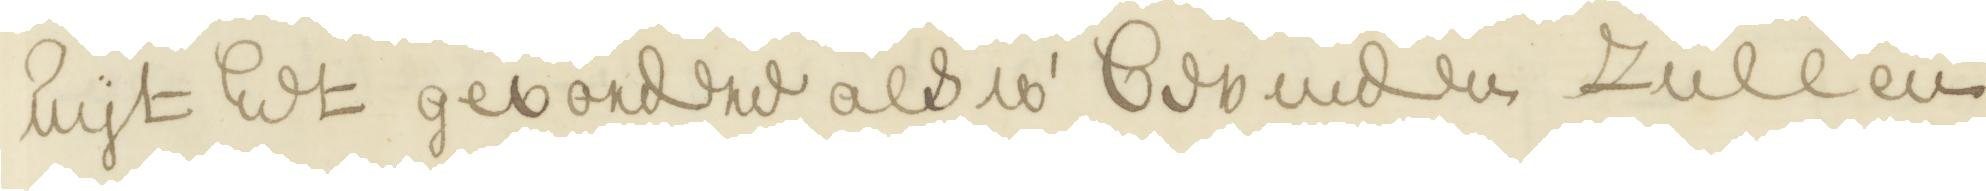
uijt het gevordere als w' bevinden zullen
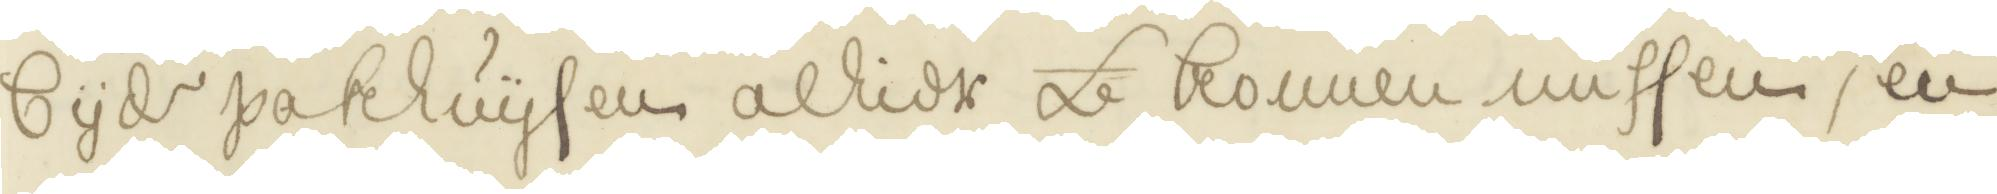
bij de pakhuijsen alhier te konnen missen, en
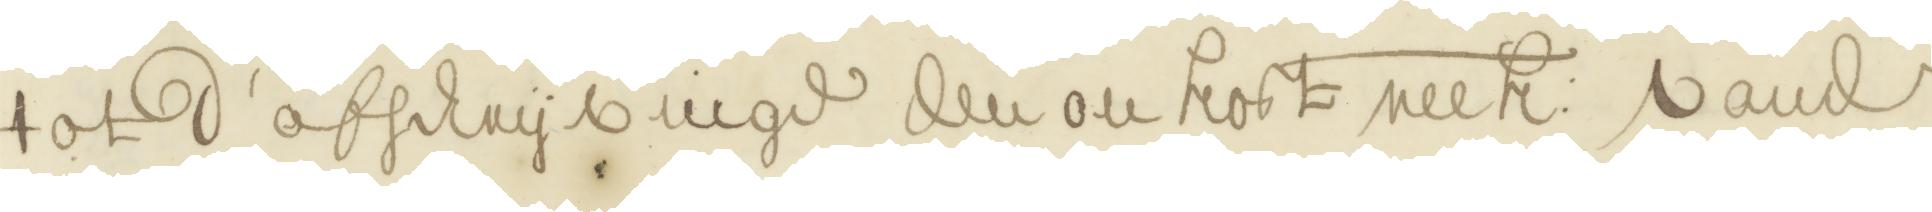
tot d’afschrijvinge den onkost reek: van de
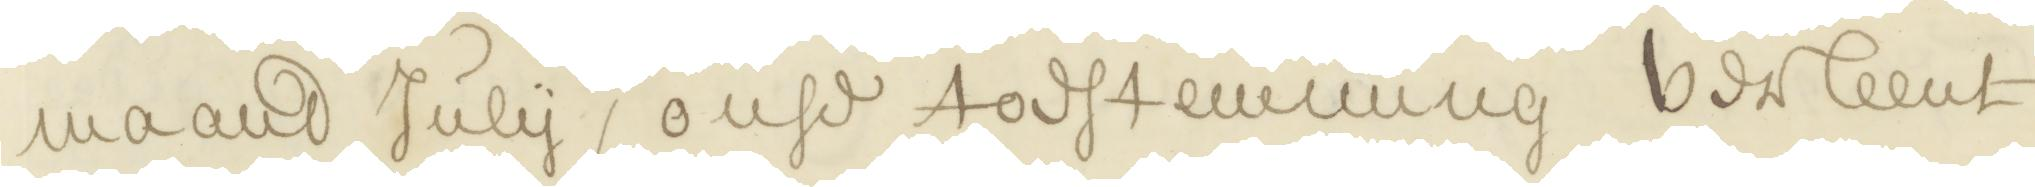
maand Julij, onse toestemming verleent
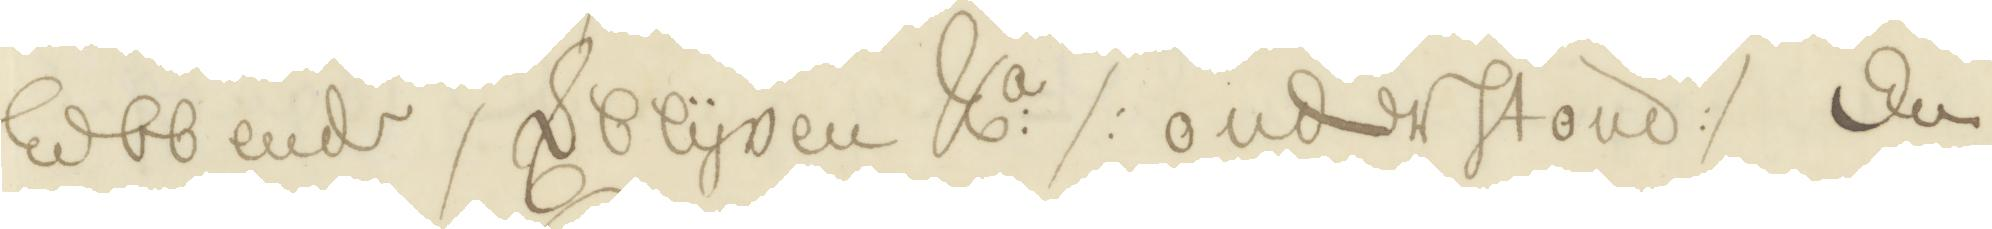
hebbende / verblijven &:a /:onderstond:/ En
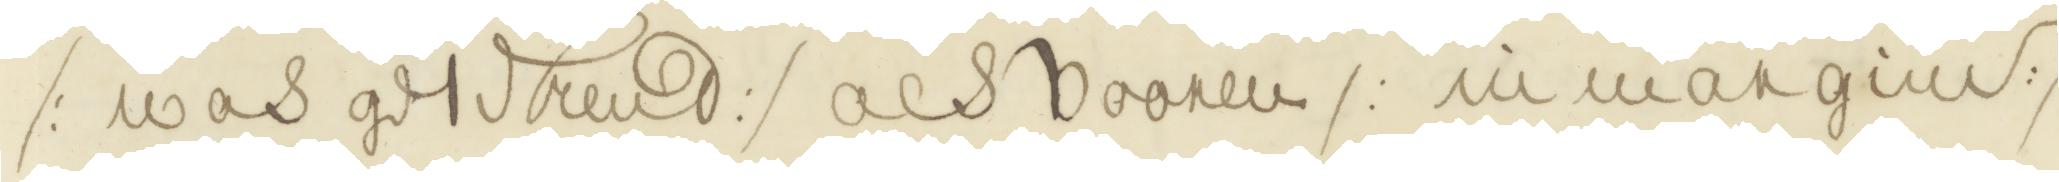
/:was getekend:/ als vooren /: in margine:
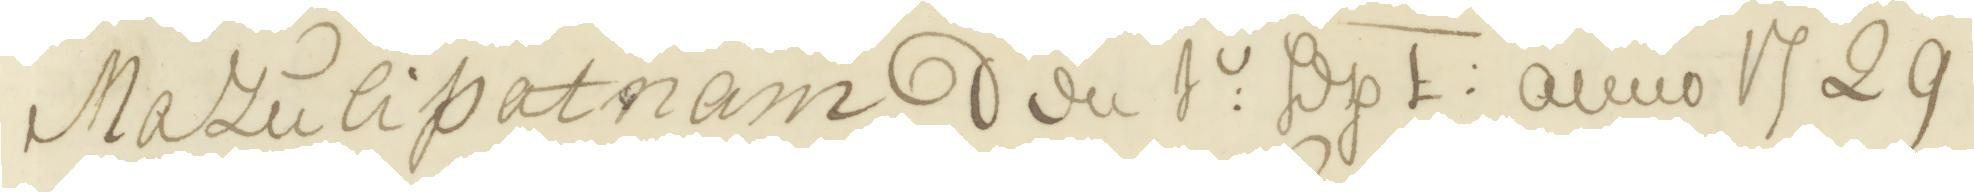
Mazulipatnam den 1:' sept: anno 1729
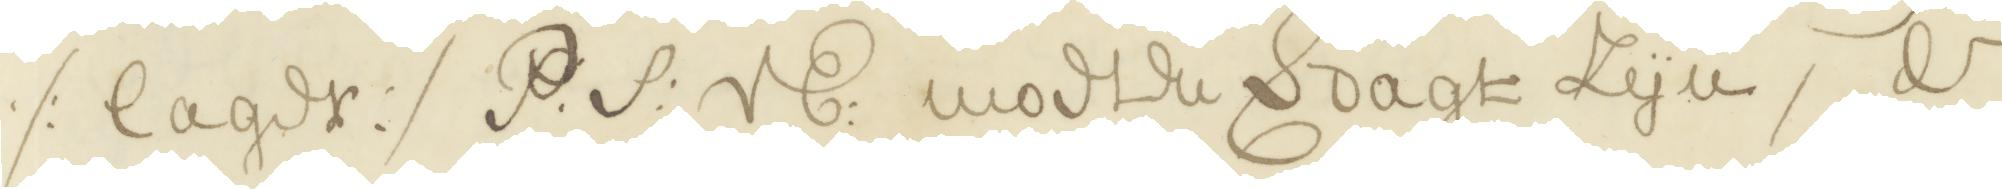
/: lager:/ P: S: VE: moeten verdagt zijn, de
